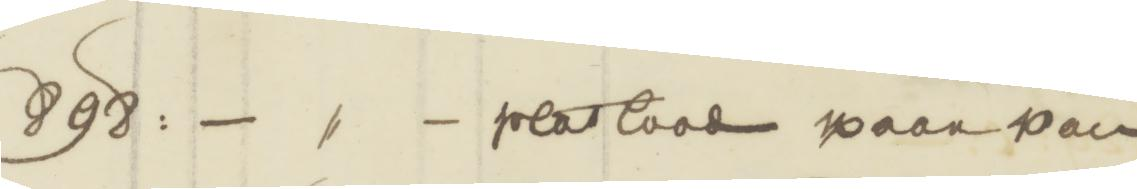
898: —„ — plat lood waar van
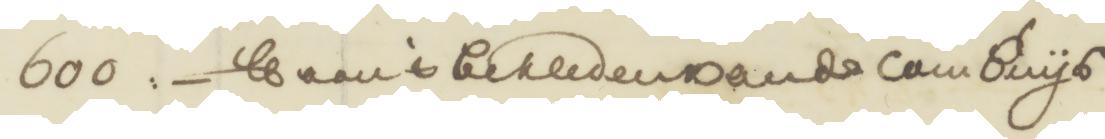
600: — lb aan ’t bekleden vande cambuijs
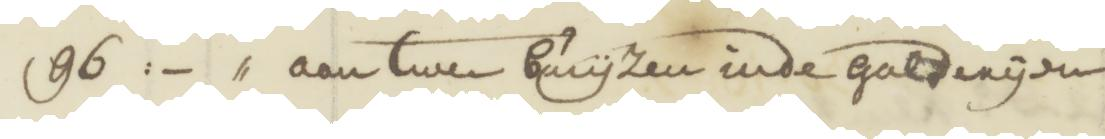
96: — „ aan twee buijzen inde galderijen
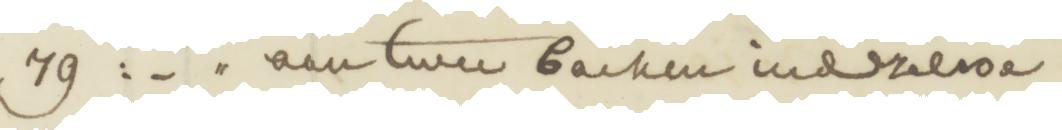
79: — „ aan twee baeken indezelve
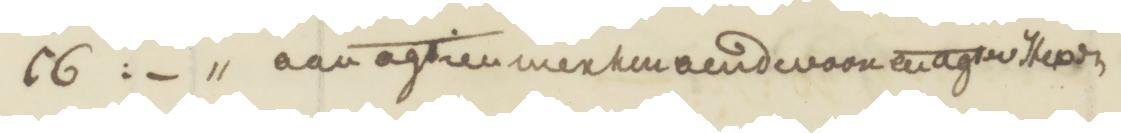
56: — „ aan agtien merken aende voor en agter steven
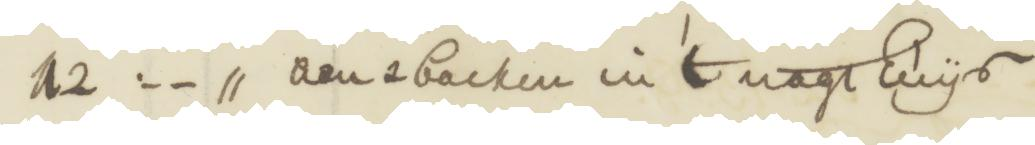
42: —— „ aen t baeken in ’t nagt huijs
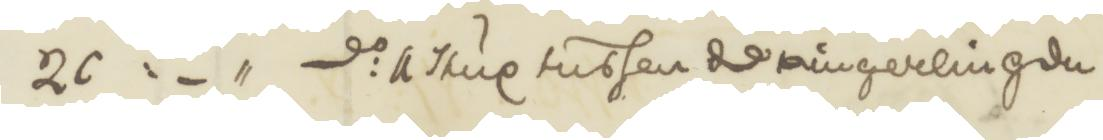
26: — „ d:o 4 stux tussen de vingerlingen
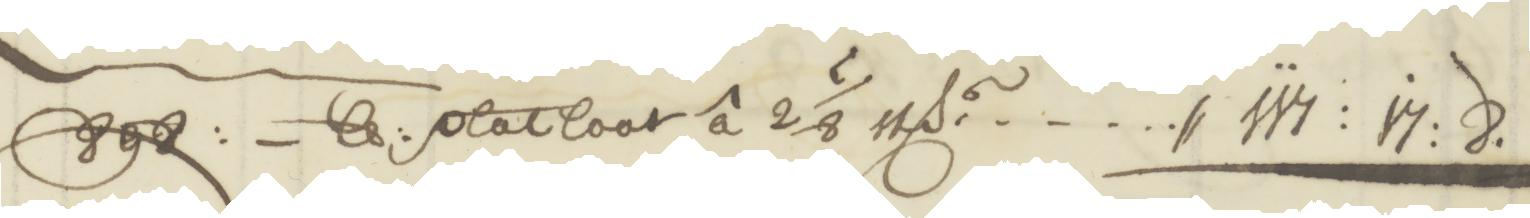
898: — lb: platloot â 2 5/8 stver:s - - - . .„ 117: 17: 8.
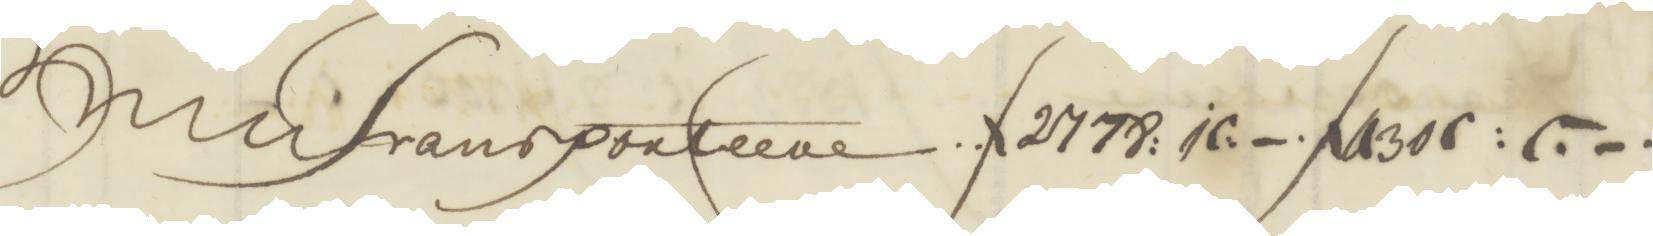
Transporteere..ƒ 2778: 15:—. ƒ4305: 5. —.
